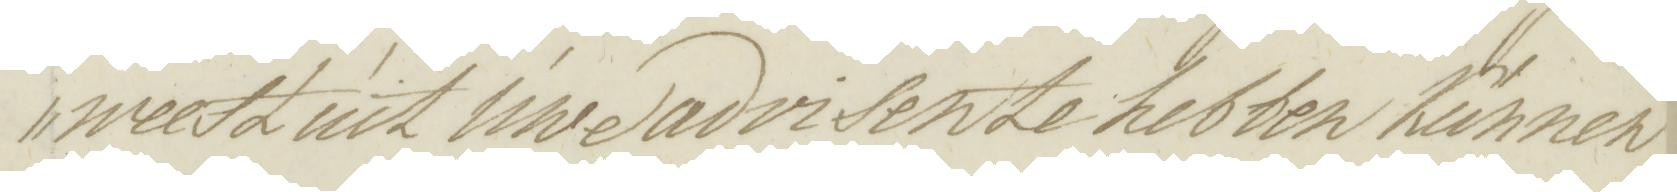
„weest uit uwe advisen te hebben kunnen
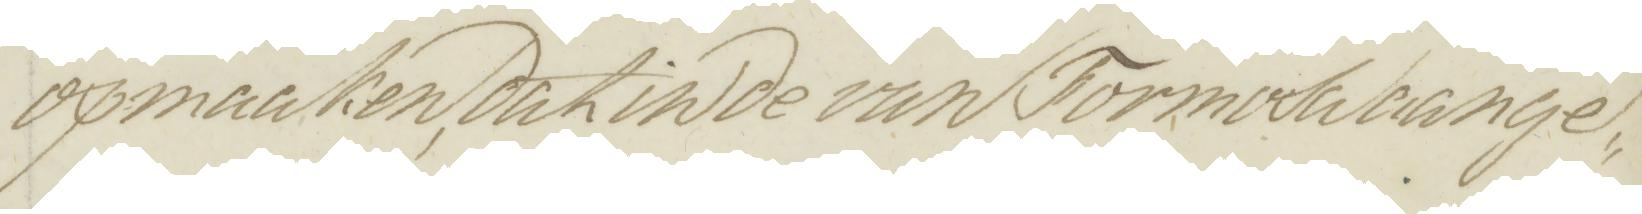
opmaaken dat in de van Formosa aange„
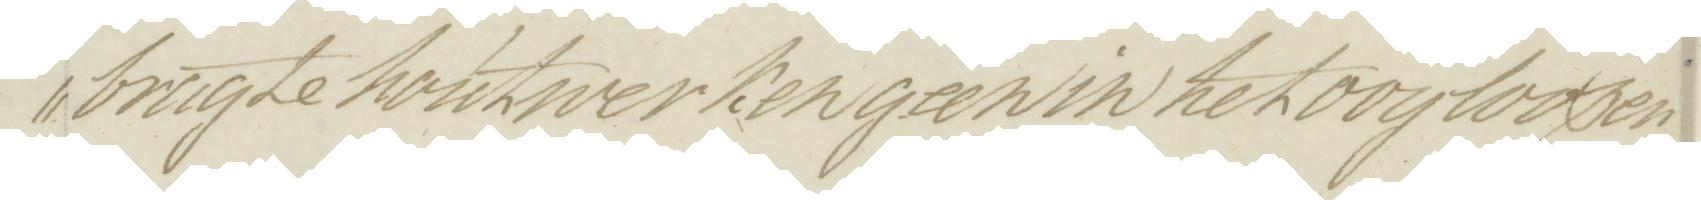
„bragte houtwerken geen in het oogloopen
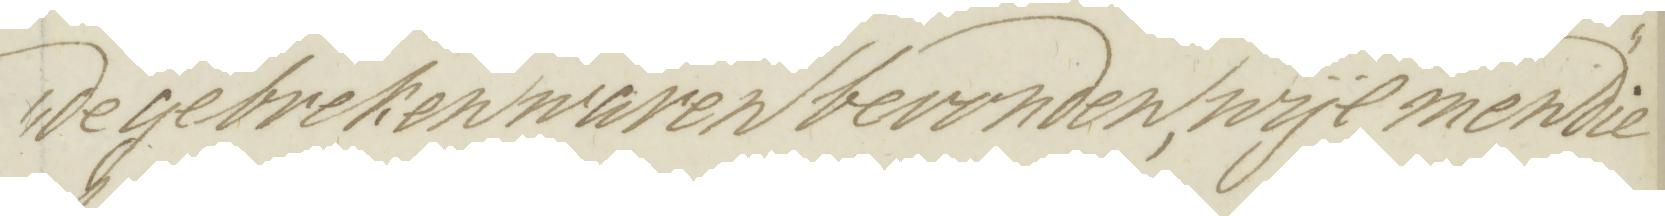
de gebreken waren bevonden, wijl men die
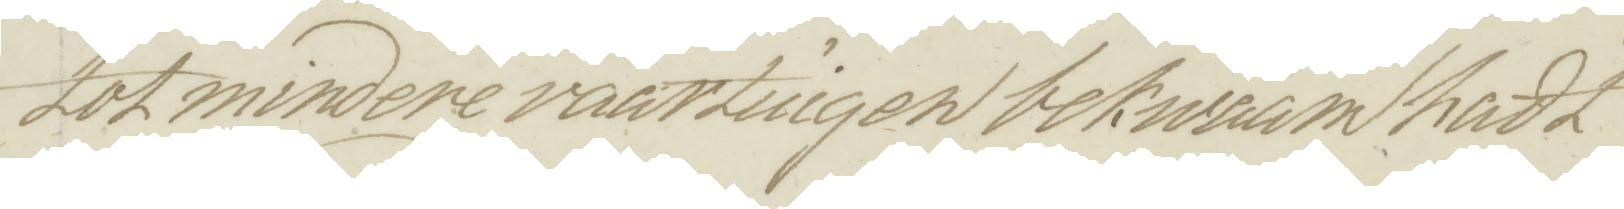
tot mindere vaartuigen bekwaam hadt
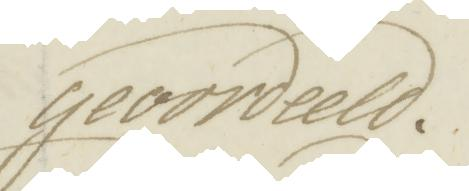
geoordeeld.
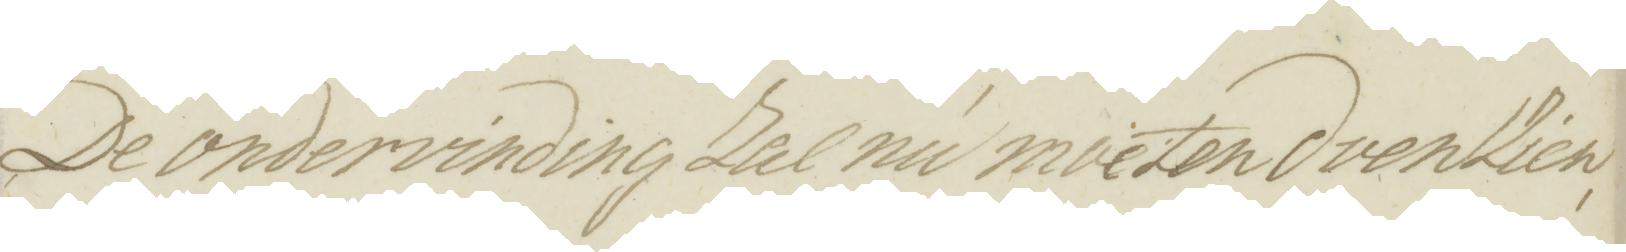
De ondervinding Zal nu moeten doen Zien,
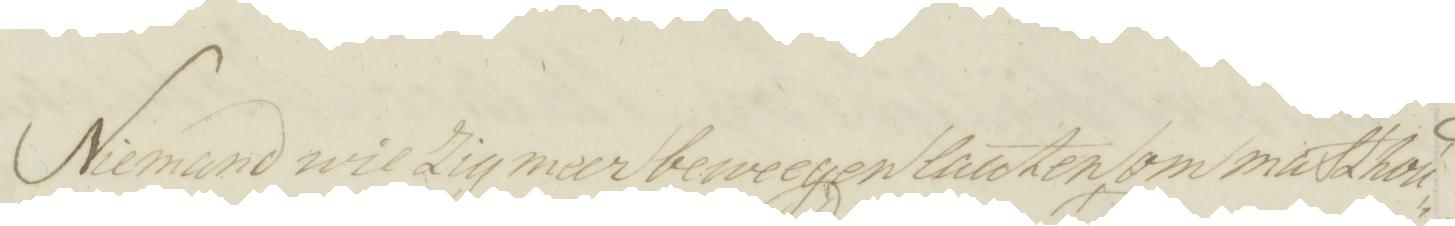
Niemand wil Zig meer beweegen laaten om masthout„
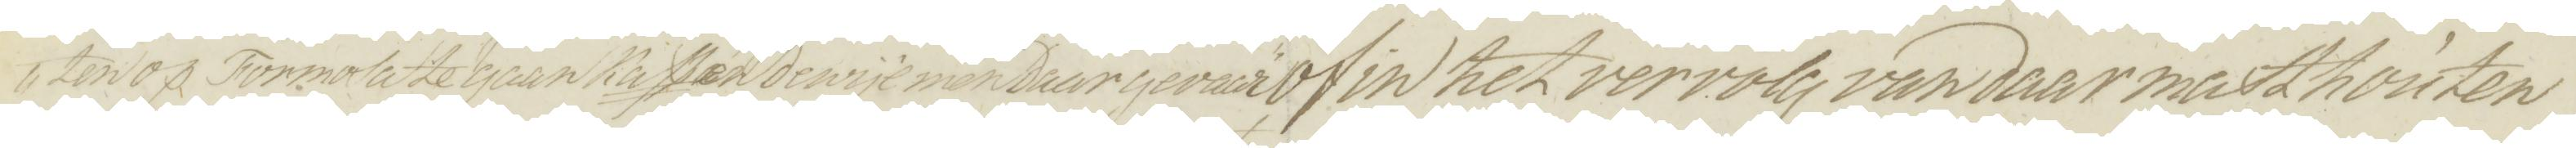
„en op Formosa te gaan Kappen dewijl men daar gevaar of in het vervolg van daar masthouten
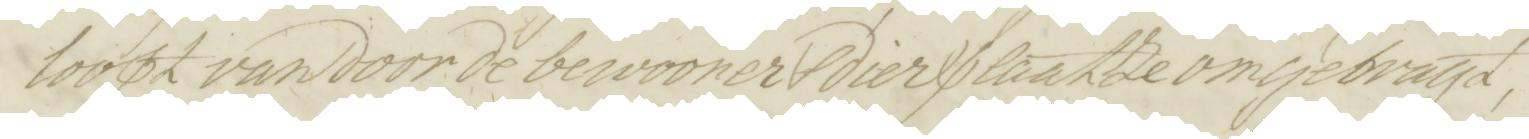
loopt van door de bewooners dier plaatze omgebragt,
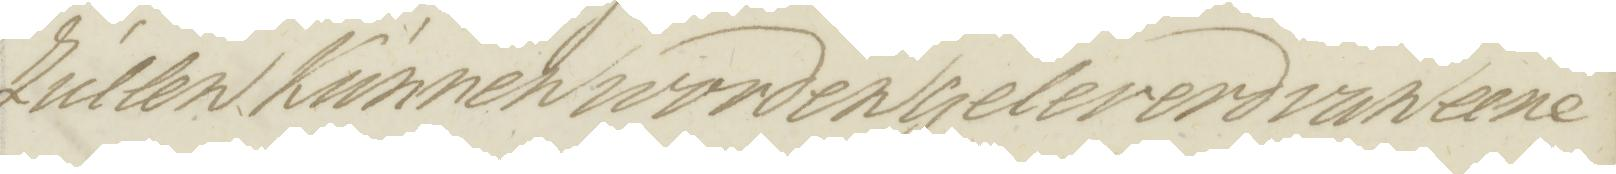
Zullen kunnen worden geleverd van eene
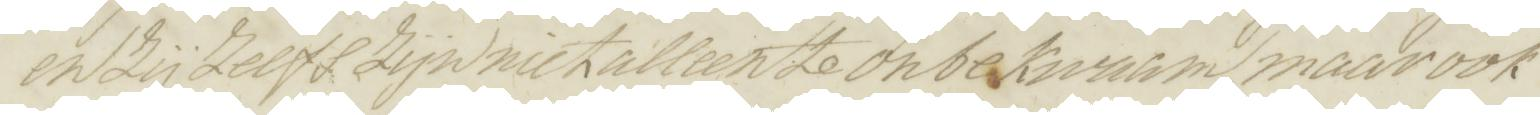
en Zij Zelfs Zijn niet alleen te onbekwaam, maar ook
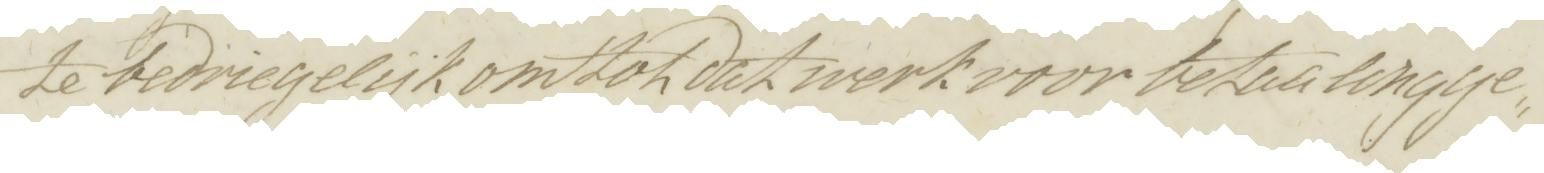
te bedriegelijk om tot dat werk voor betaaling ge„
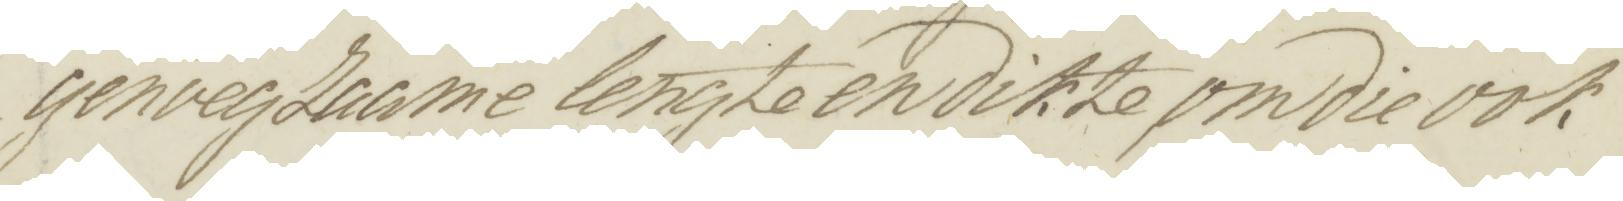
genoeg Zaame lengte en dikte om die ook
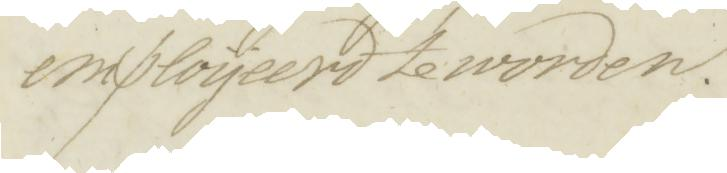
emploijeerd te worden.
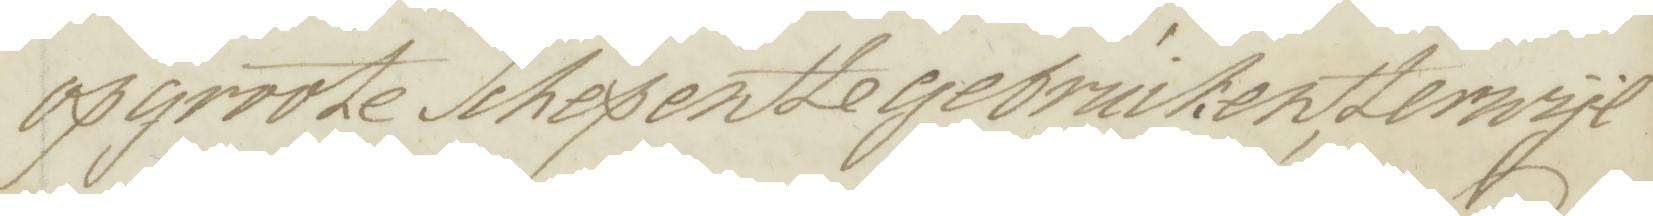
op groote Schepen te gebruiken, terwijl
